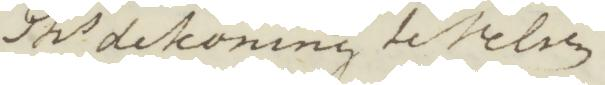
Phs de koning te Velsen
